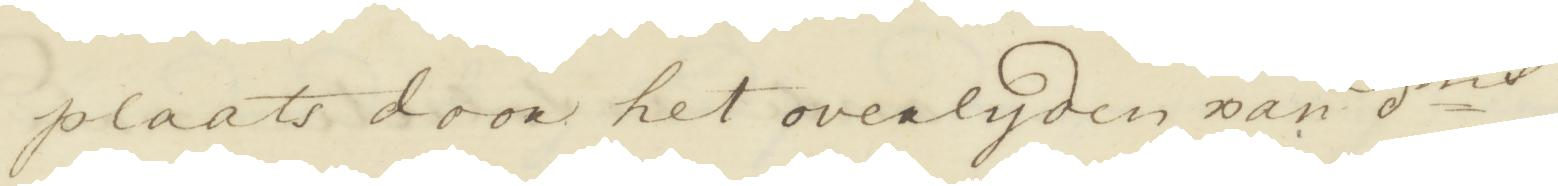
plaats door het overlyden van d=ms
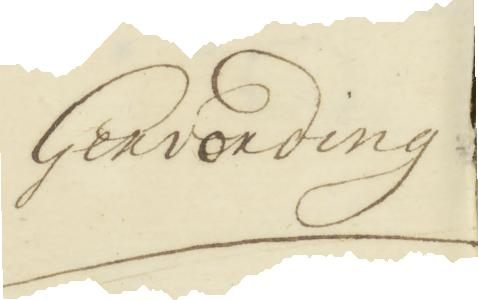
Gervording
